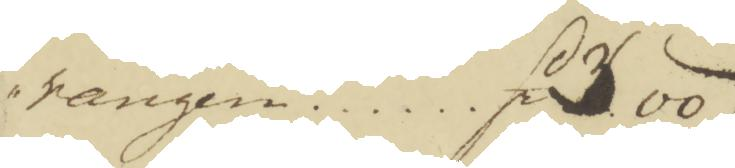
„vangen..... fr. 100.
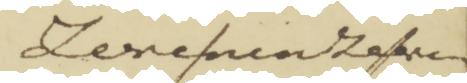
Zevenen zeven
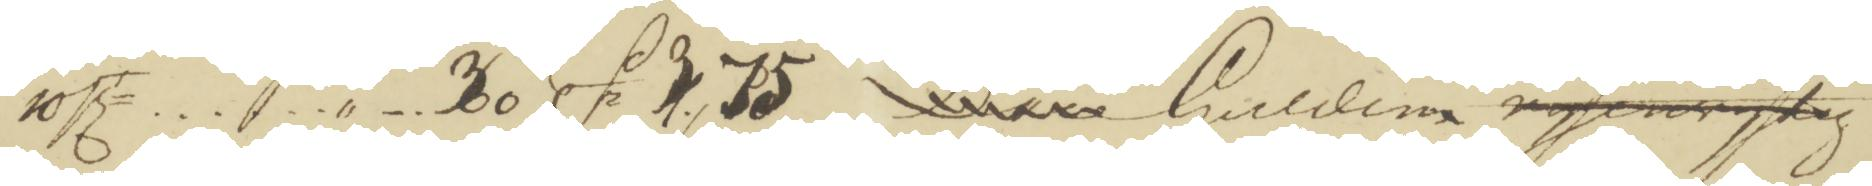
10 /c=t . . . . . . „ - - 30 ƒ3. 75 Drie Gulden vyfenvyftig
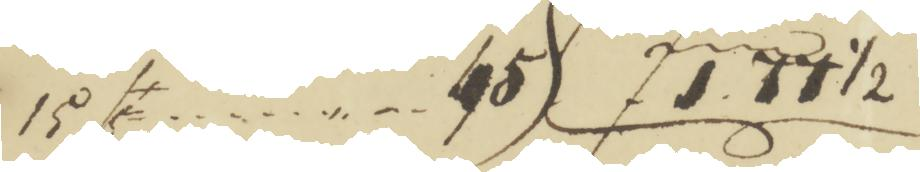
15 /c=t . . . . . . „ - - 45 ƒ1. 77½
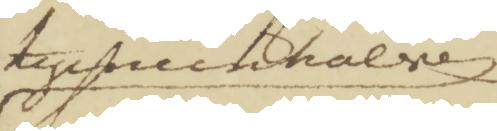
tig en een halve
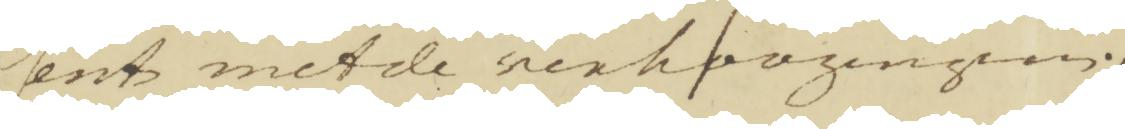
Cents met de verhoogingen.
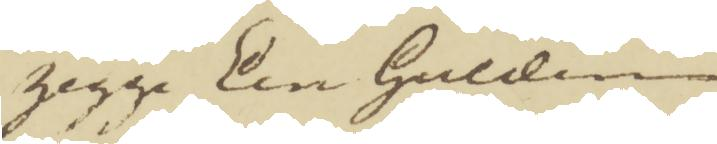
zegge Een Gulden
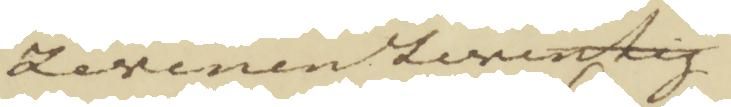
zevenen zeventig.
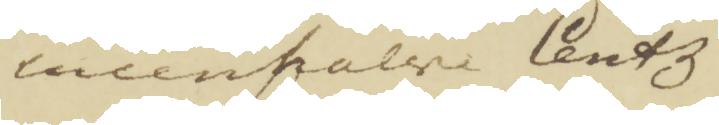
en een halve Centz
